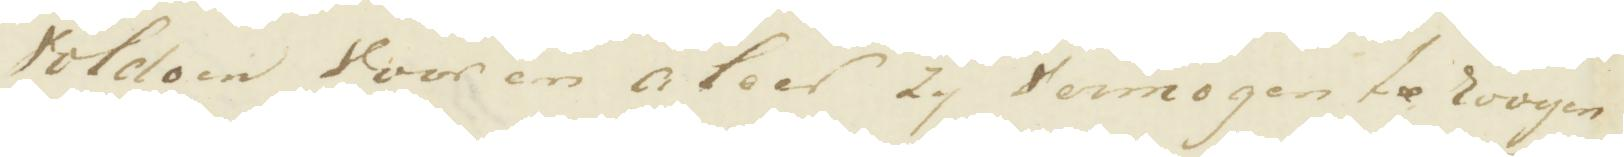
voldoen voor en aleer zy vermogen te rooyen
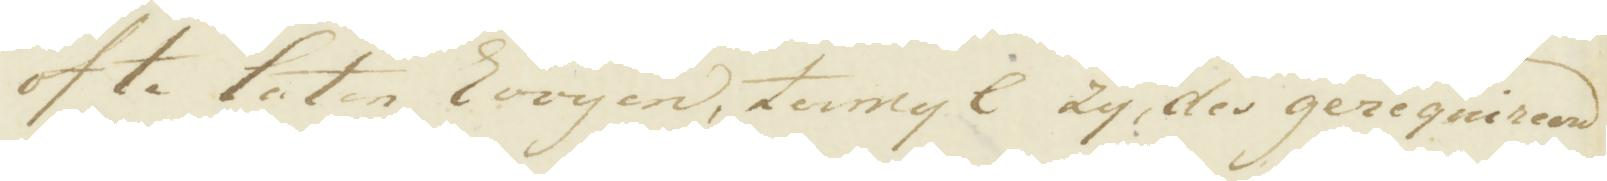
of te laten rooyen, terwyl zy, des gerequireerd
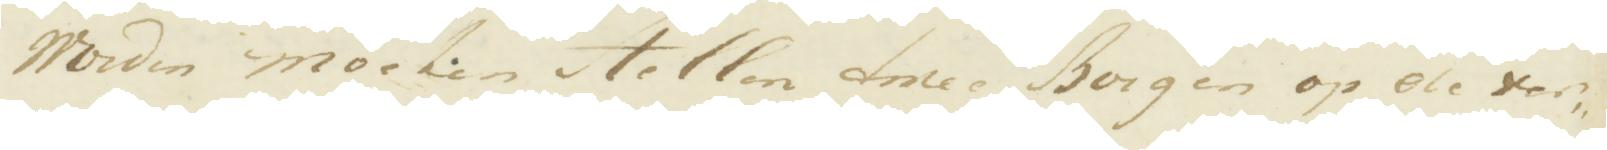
worden moeten stellen twee Borgen op de ver„
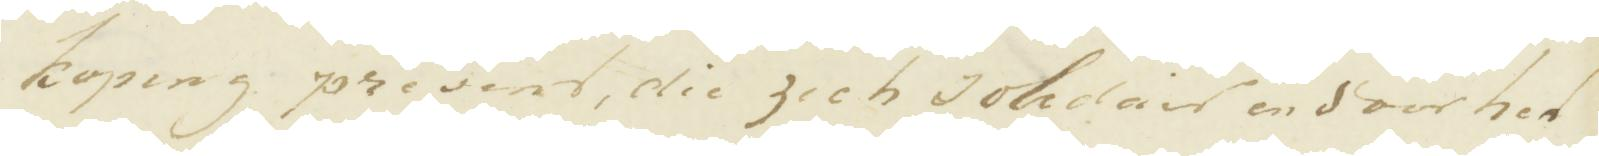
koping present, die zich solidar en voor het
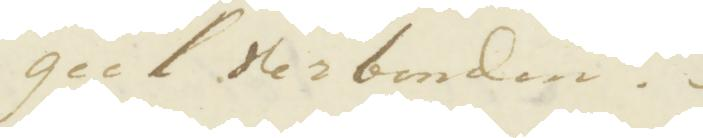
geel verbinden.
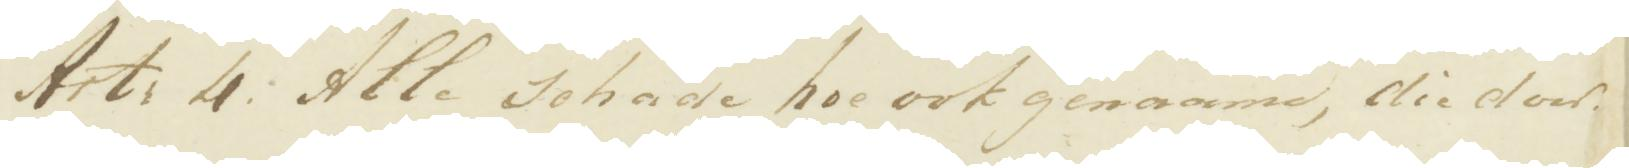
Art: 4. Alle schade hoe ook genaamd, die door
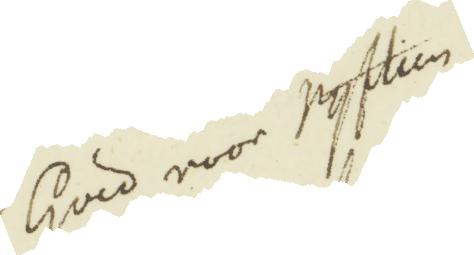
Goed voor vytftien
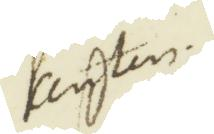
centen.
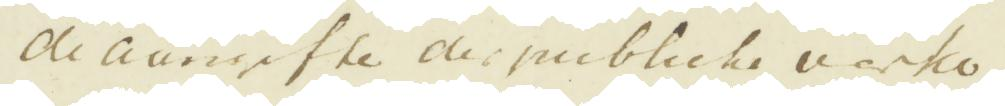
de aangifte der publieke verko
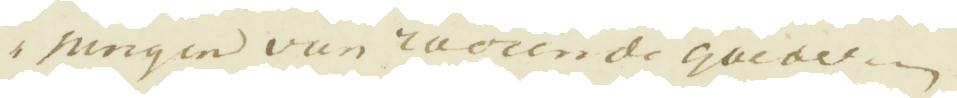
„pingen van roorende goederen
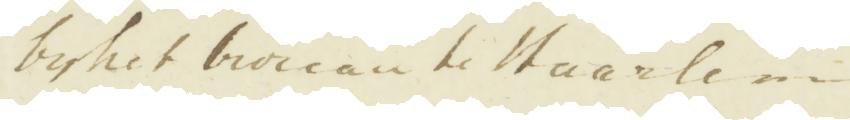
by het bureau te Haarlem
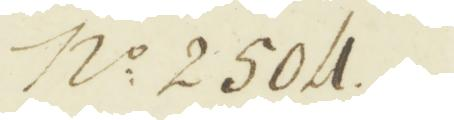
N:o 2504.
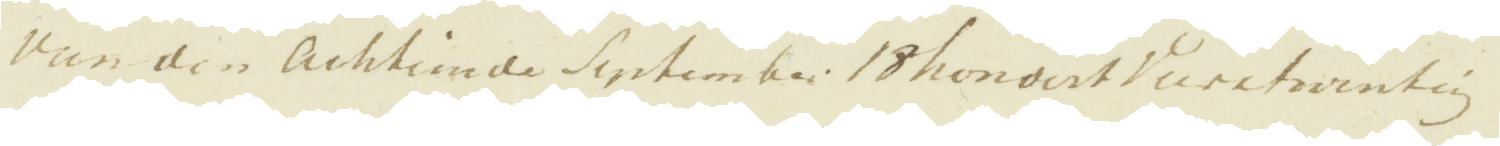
van den Achtiende September 18hondert Vieretwintig
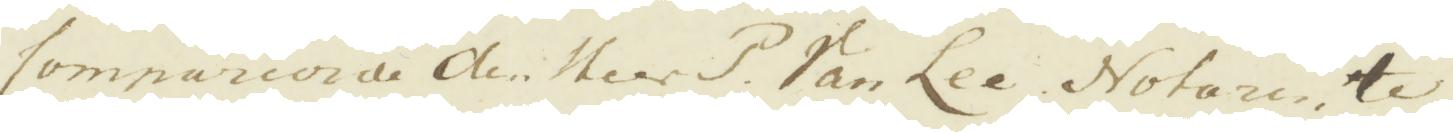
Compareerde de Heer P. Van Lee. Notaris, te
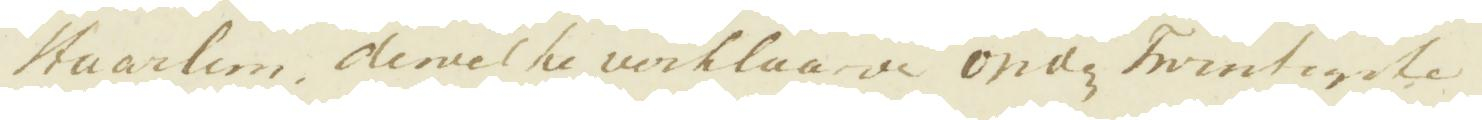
Haarlem, dewelke verklaarde op den twintigste
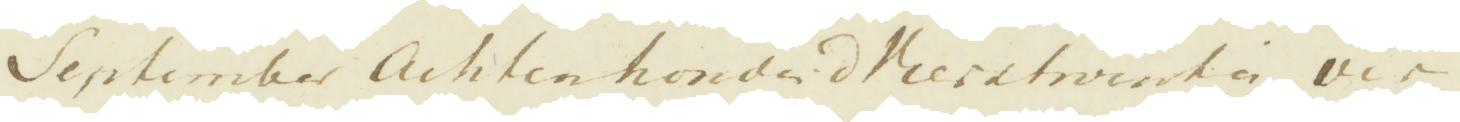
September Achtenhonderd Vieretwintig ver
